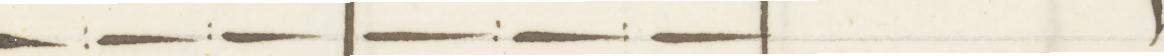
—:—:— —:—:— 1
